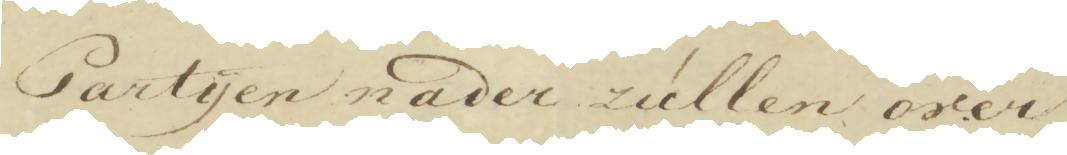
Partijen nader zullen over
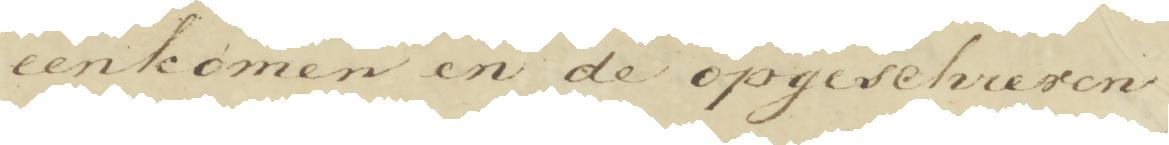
eenkomen en de opgeschreven
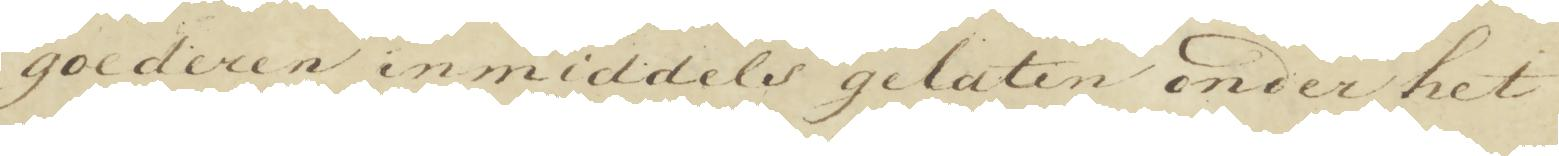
goederen inmiddels gelaten onder het
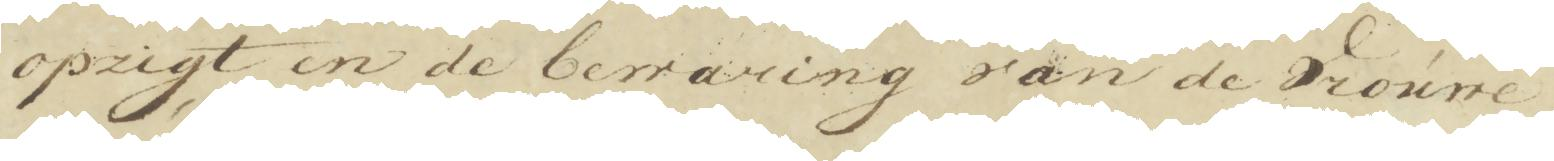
opzigt en de bewaring van de Vrouwe
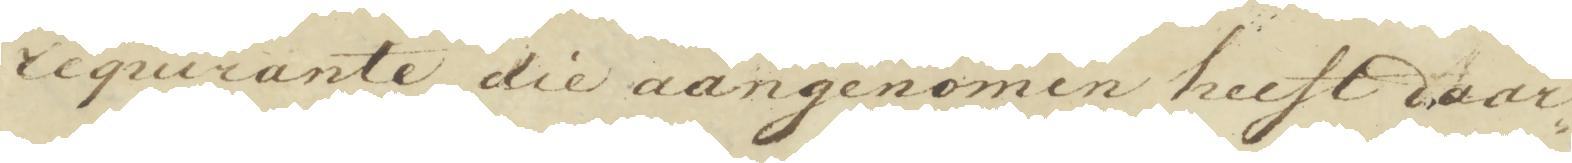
requirante, die aangenomen heeft daar
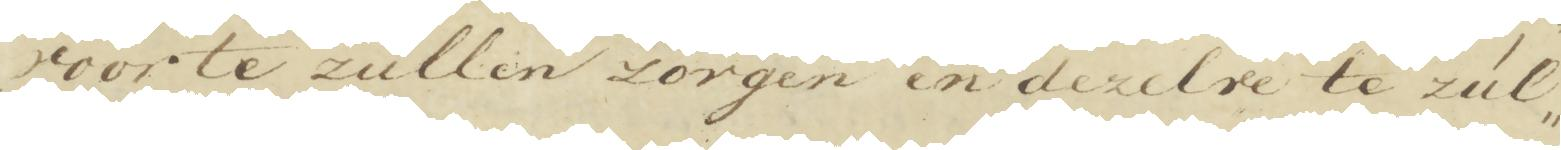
voor te zullen zorgen en dezelve te zul
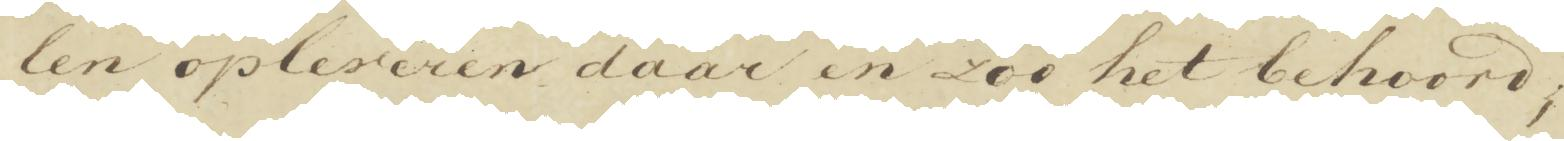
len opleveren daar en zoo het behoord,
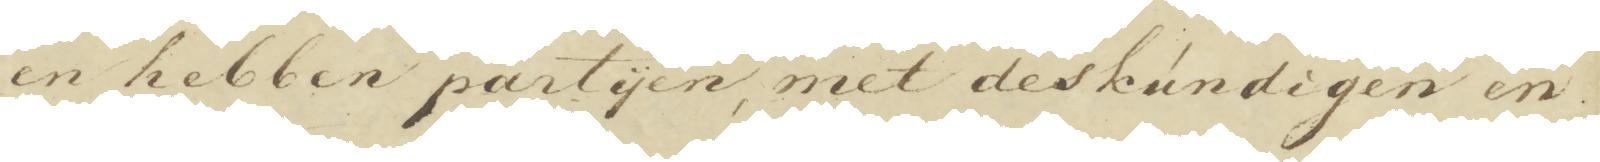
en hebben partijen, met deskundigen en
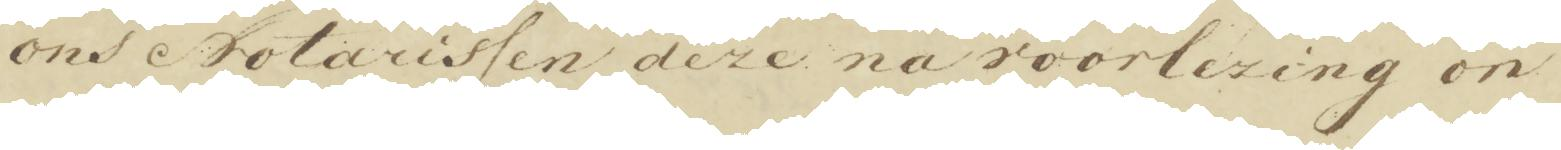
ons Notarissen deze na voorlezing on
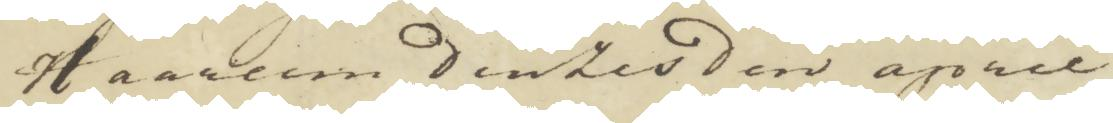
Haarlem denzes den april
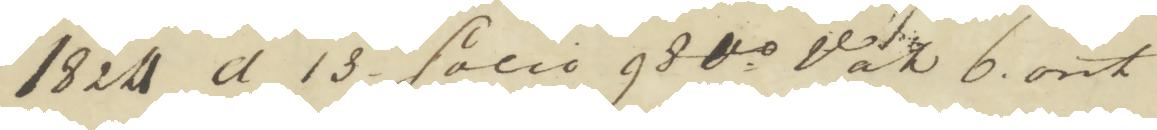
1824 d 13. folio 98V=o Vak 6. ont
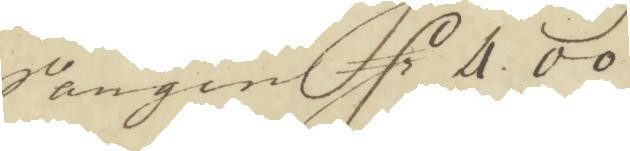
vangen ƒ 4.00
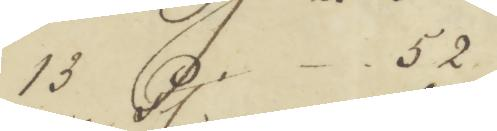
13 PC — . 52
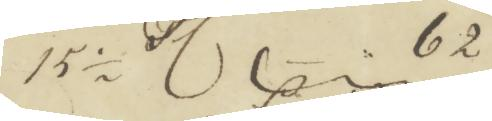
15½ — „ 62
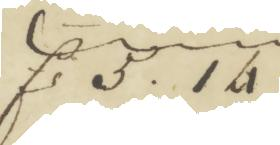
ƒ 5. 14
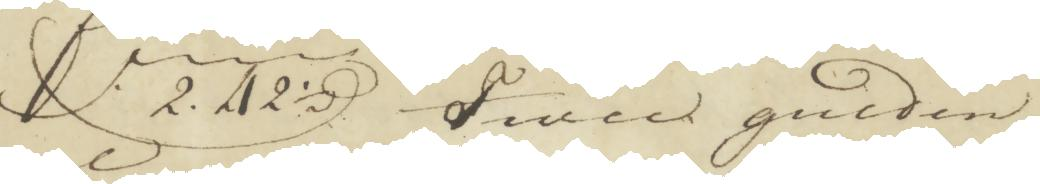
2.42½ Twee gulden
